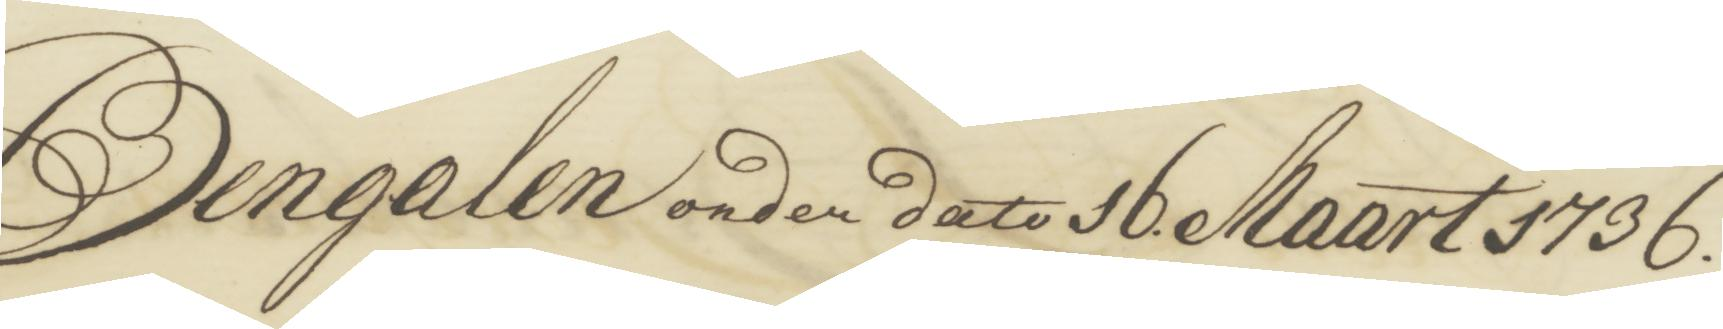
Van Bengalen onder dato 16. Maart 1736.
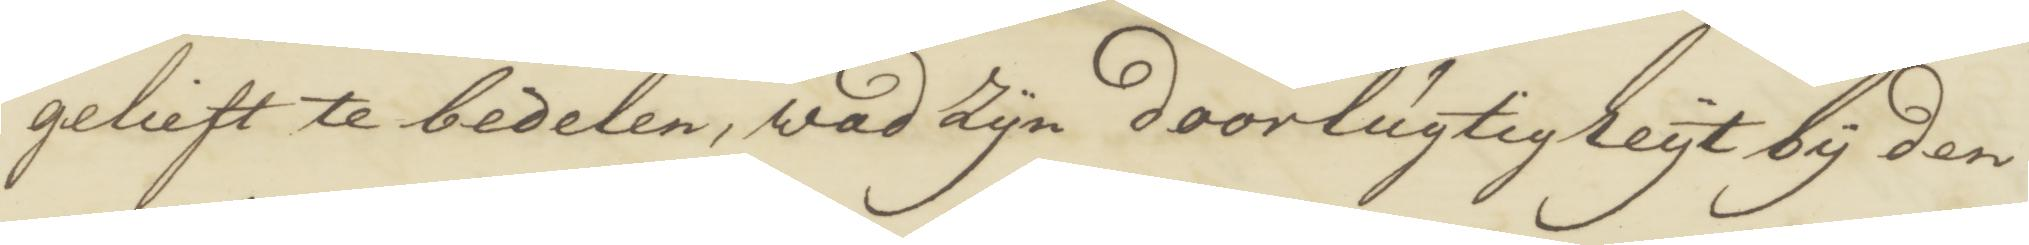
gelieft te bedelen, wad zijn doorlugtigheijt bij den
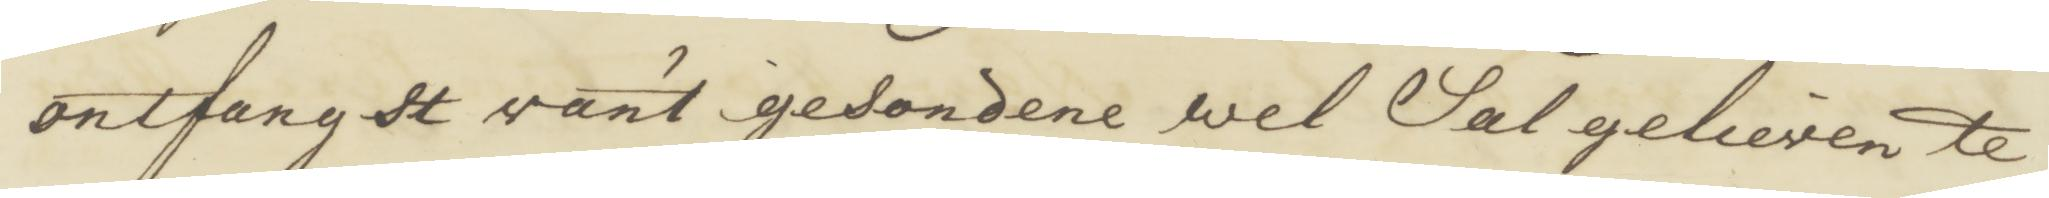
ontfangst van’t gesondene wel sal gelieven te
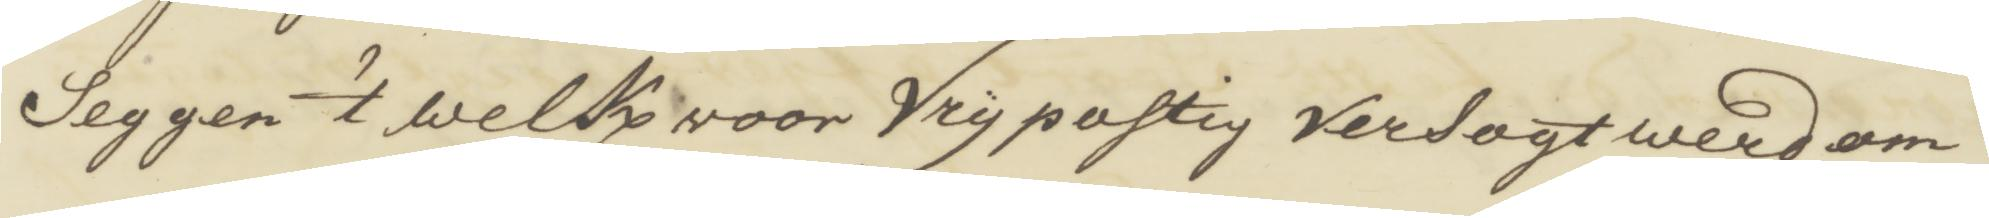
seggen ’t welk voor Vrij postig versogt werd om
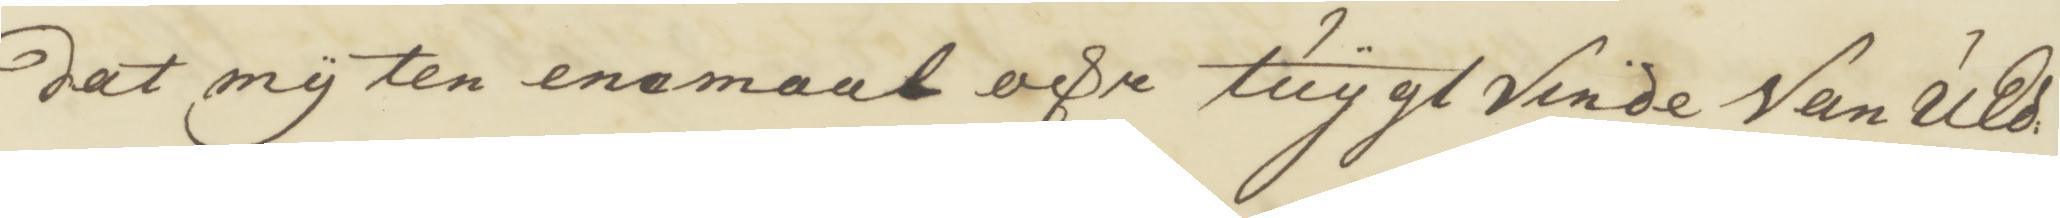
dat mij ten enamaal overr tuijgt vinde van UEd.
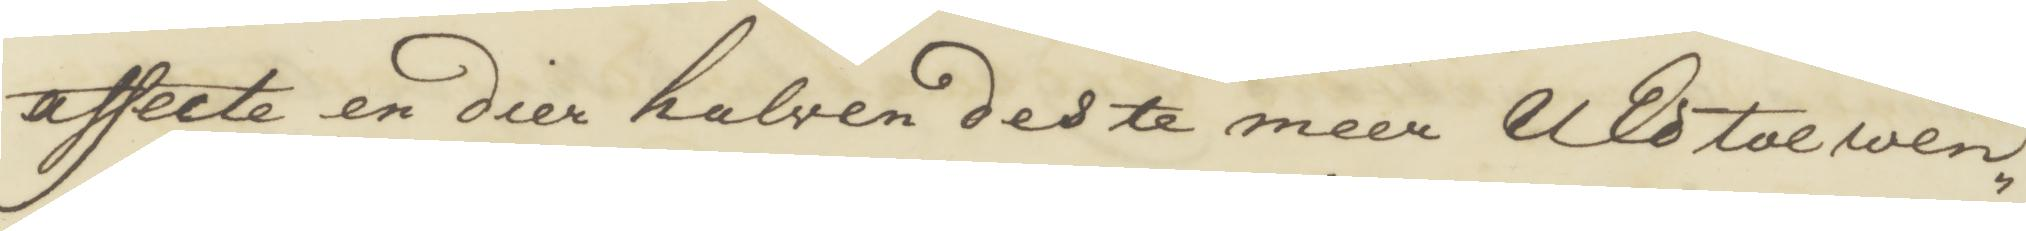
affecte en dier halven des te meer UEd toe wen„
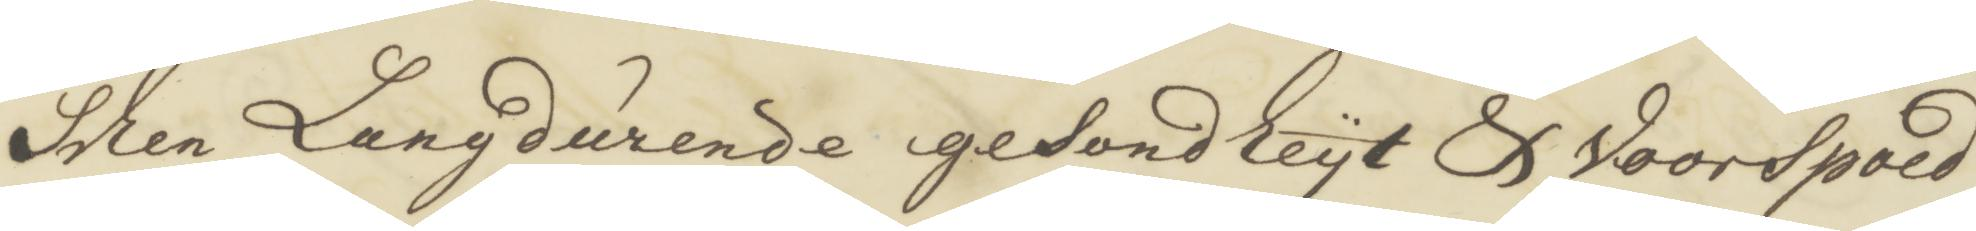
schen Langdurende gesondheijt & voorspoed
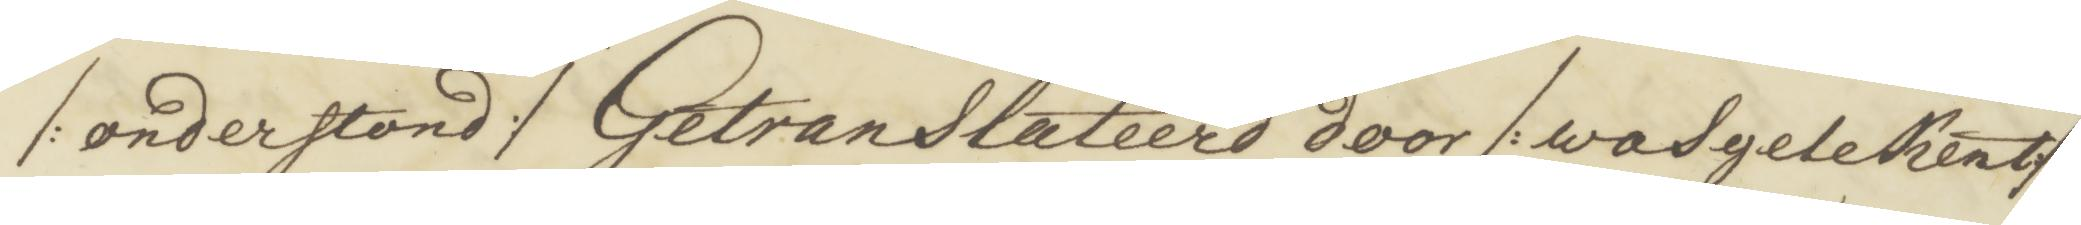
/:onderstond :/ Getranslateerd door /:was getekent:/
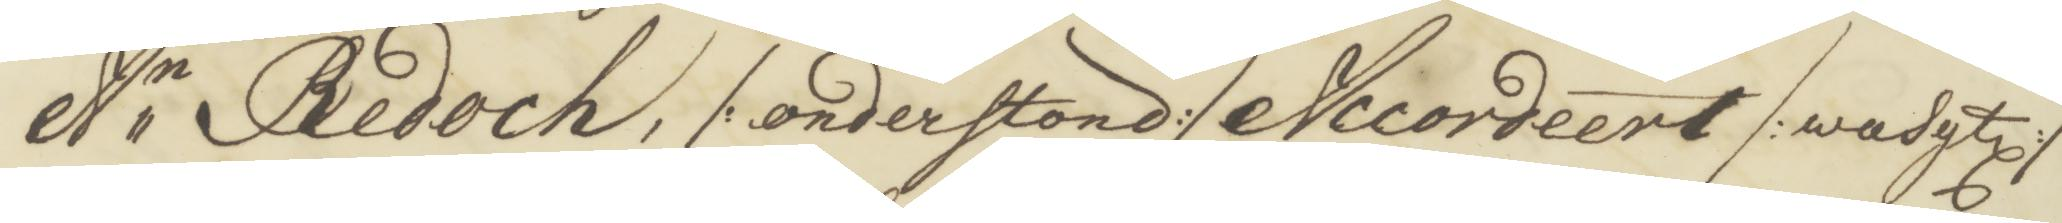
A„n Redoch, /:onderstond:/ Accordeert /:was gt:/
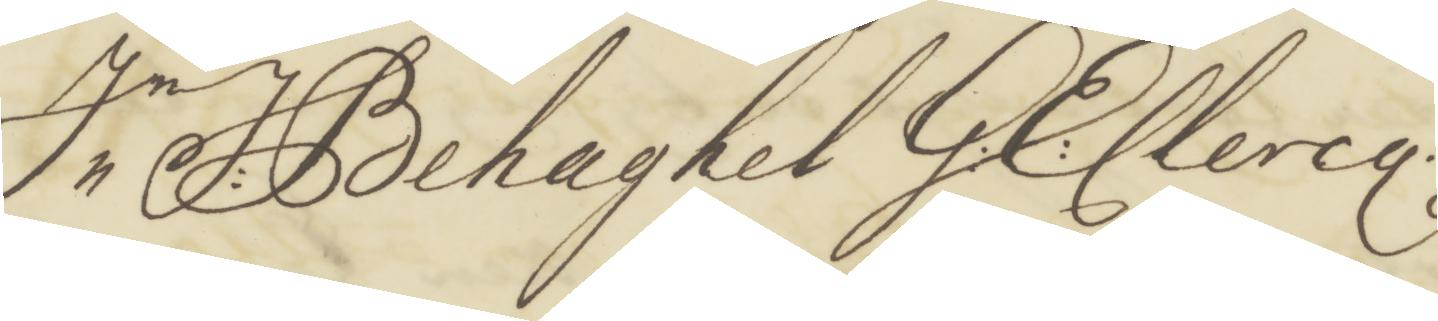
J„n J:Behaghel G:E:Clercq.
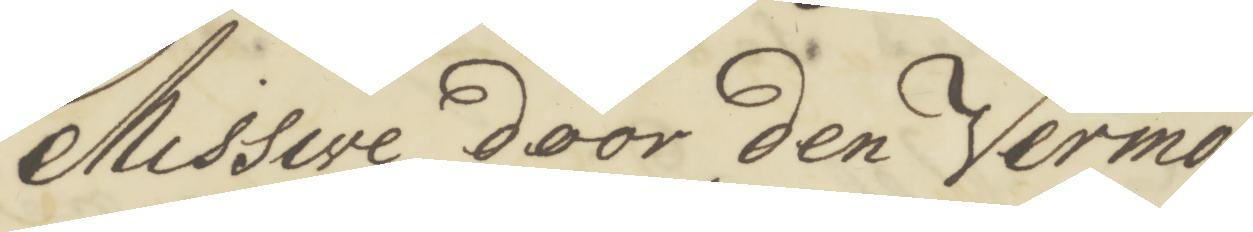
Missive door den Vermo
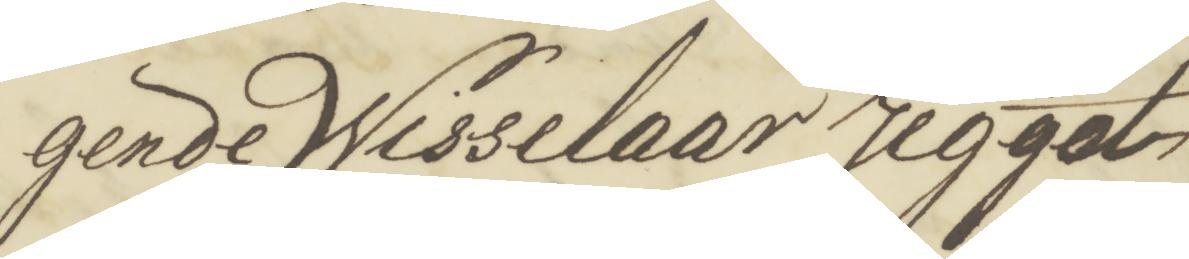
gende Wisselaar Jegget
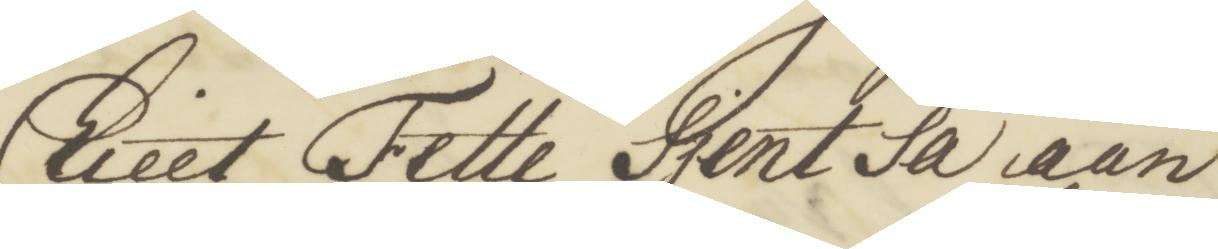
Chieet Fette Sjentsa aan
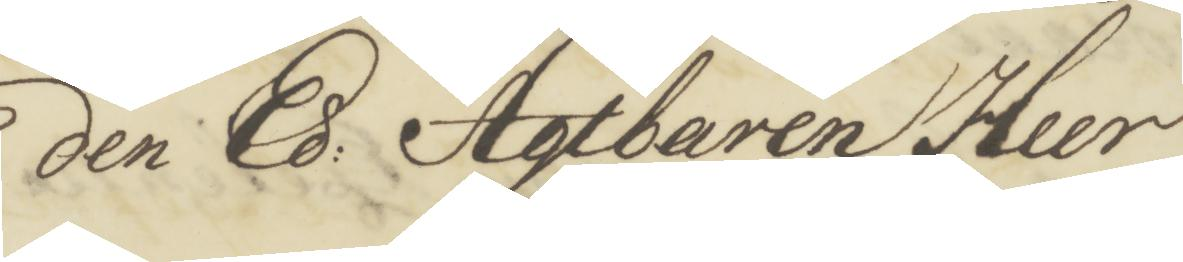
den Ed: Agtbaren Heer
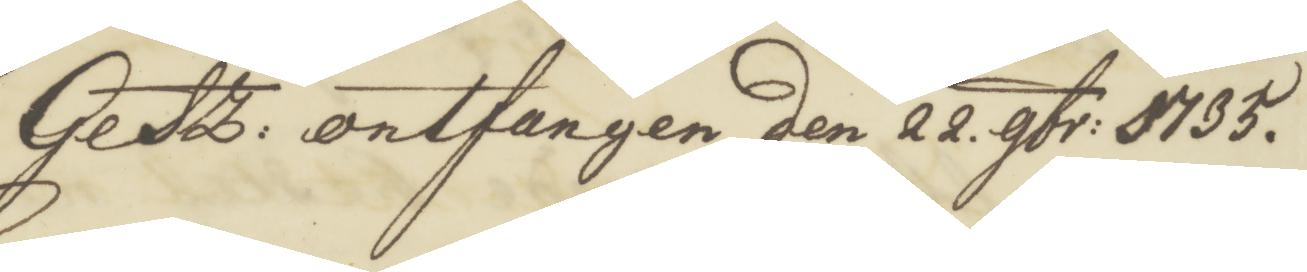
Gesz: ontfangen den 22. 9br: 1735.
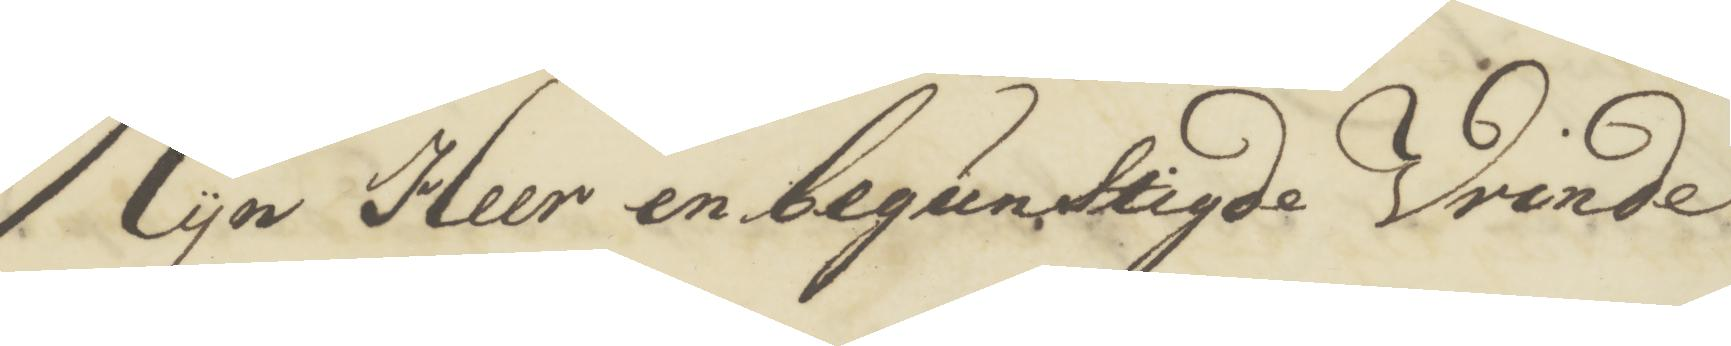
Mijn Heer en begunstigde Vrinde
